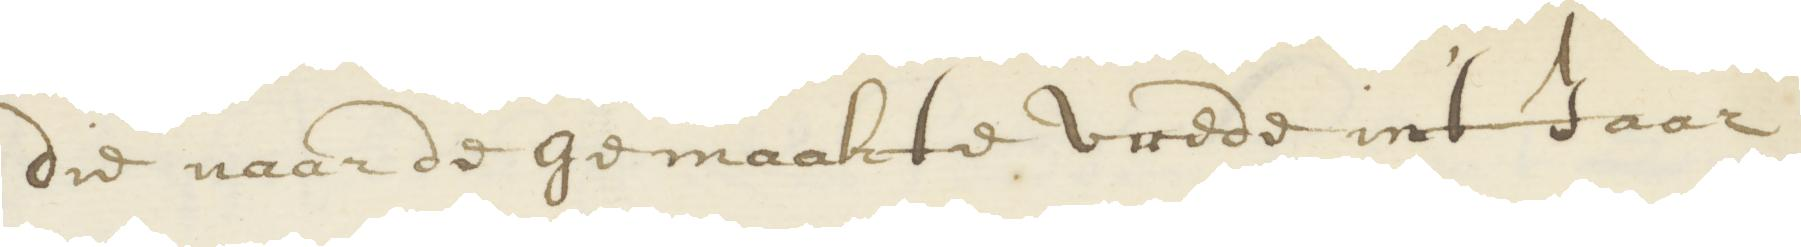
die naar de gemaakte vrede in't Jaar
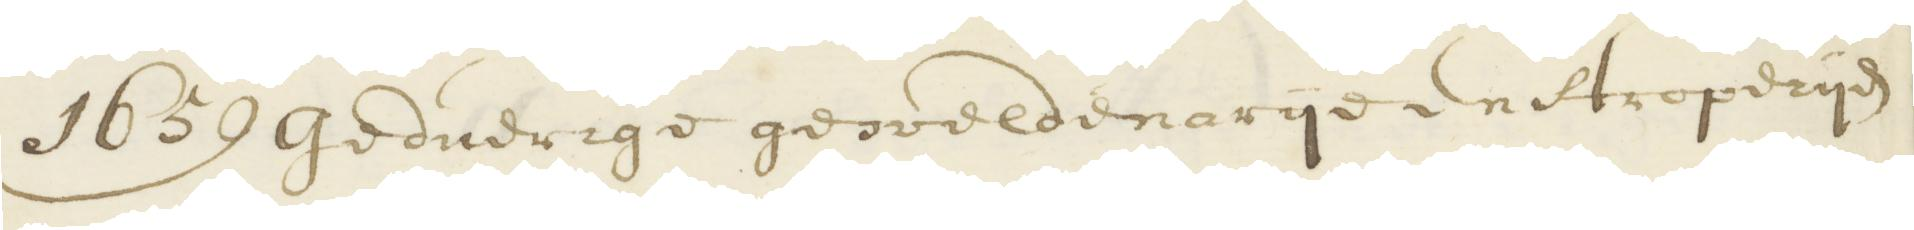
1659 geduerige geweldenarije en stroperijen
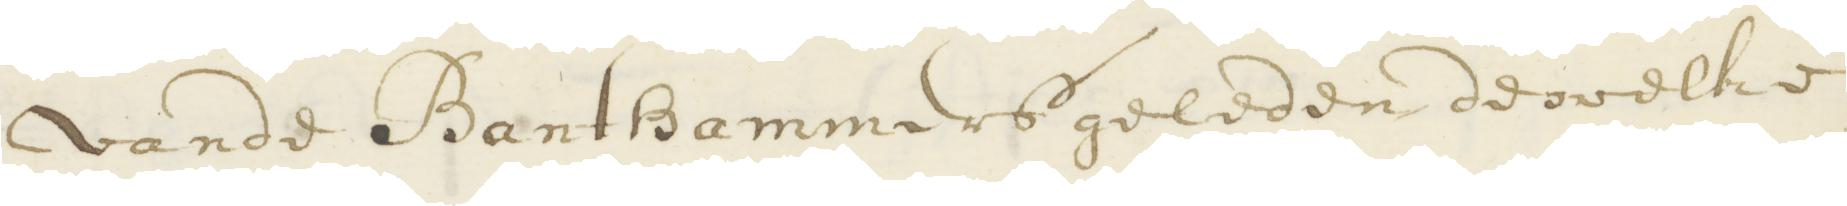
van de Banthammers geleden dewelke
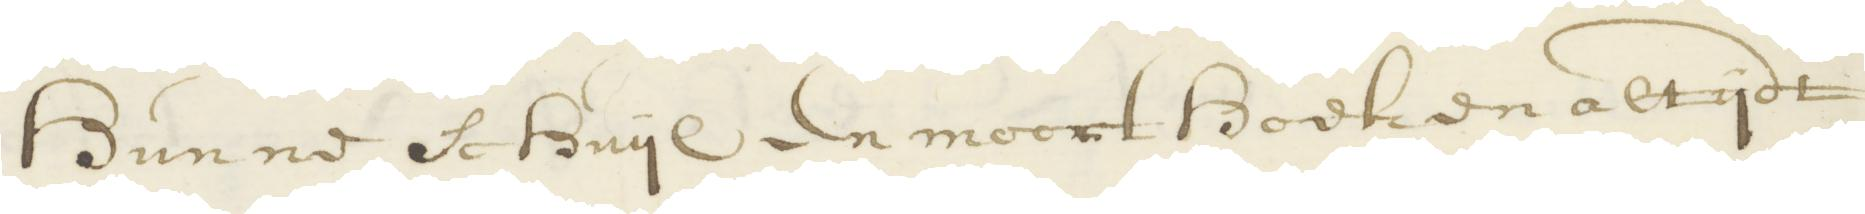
hunne schuijl en moort hoeken altijdt
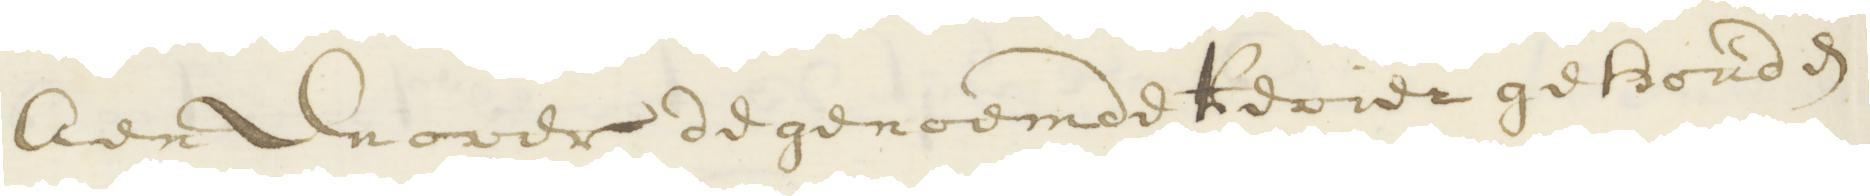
aen En over de genoemde Revier gehouden
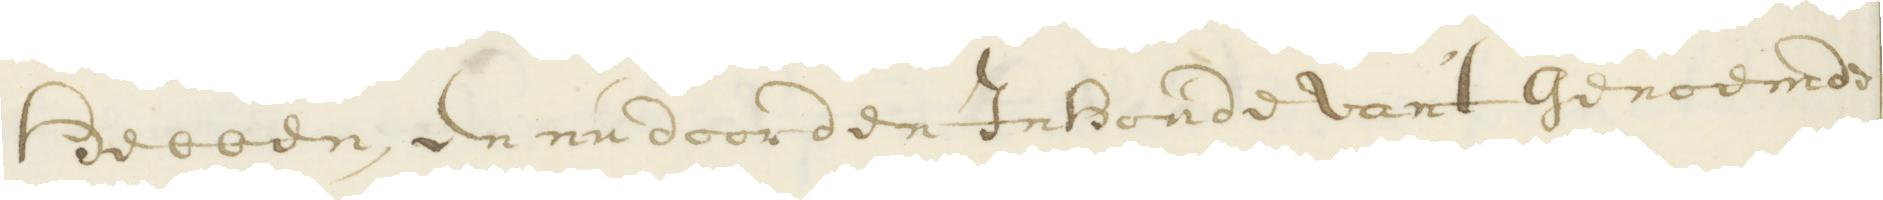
hebben, en nu door den Inhoude van’t genoemden
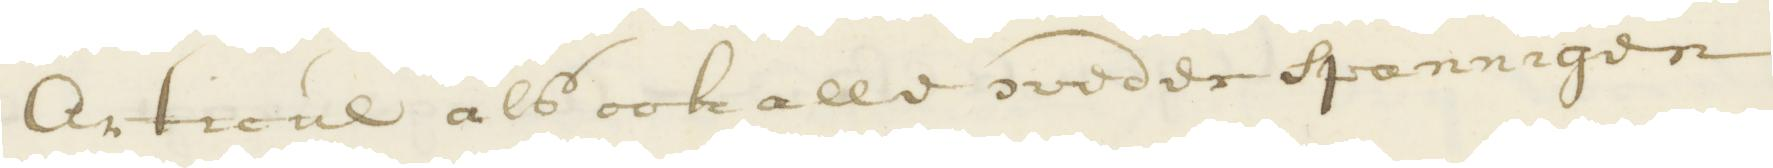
arficul als ook alle weder spannigen
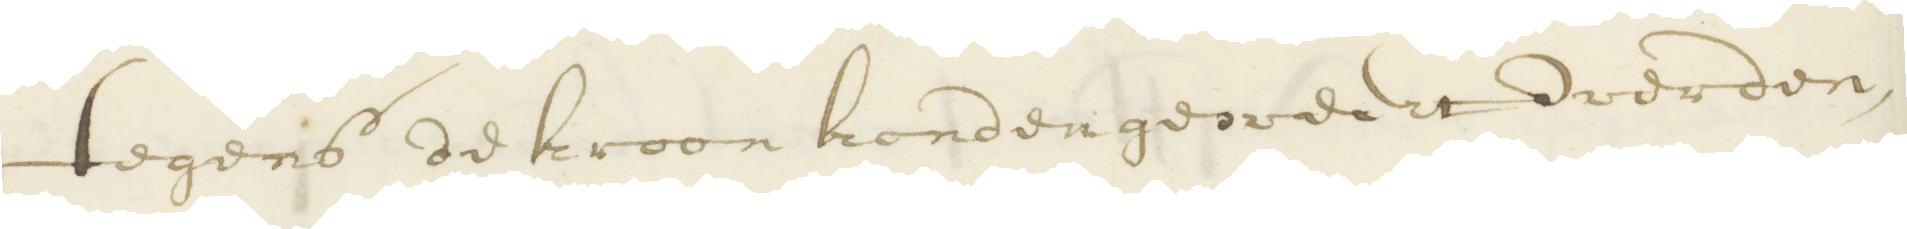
tegens de kroon konden geweert werden,
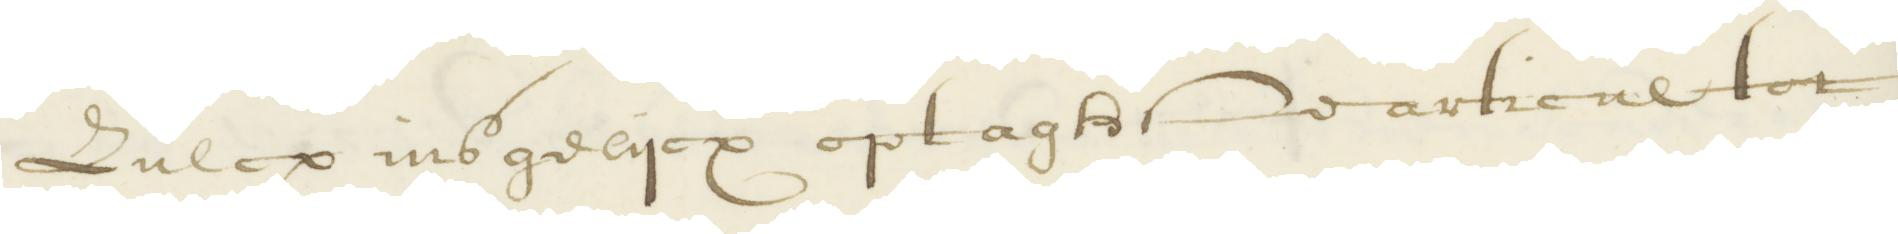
zulcx insgelijcx optaghse articul tot
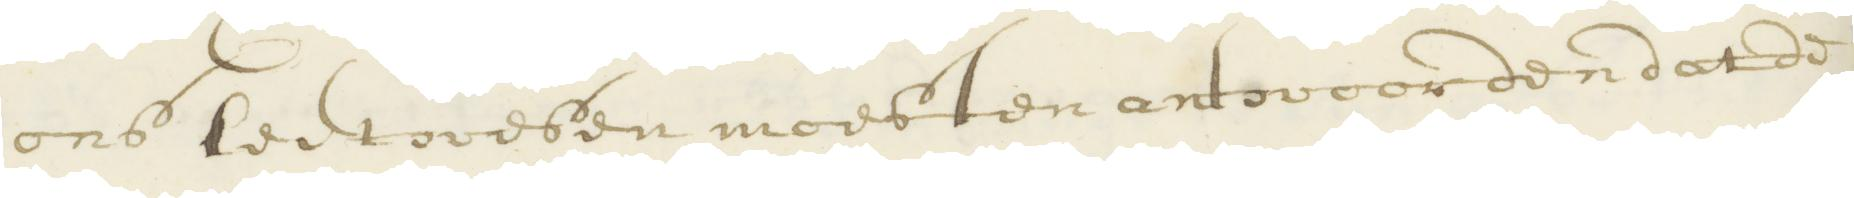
ons leetwesen moesten antwoorden dat de
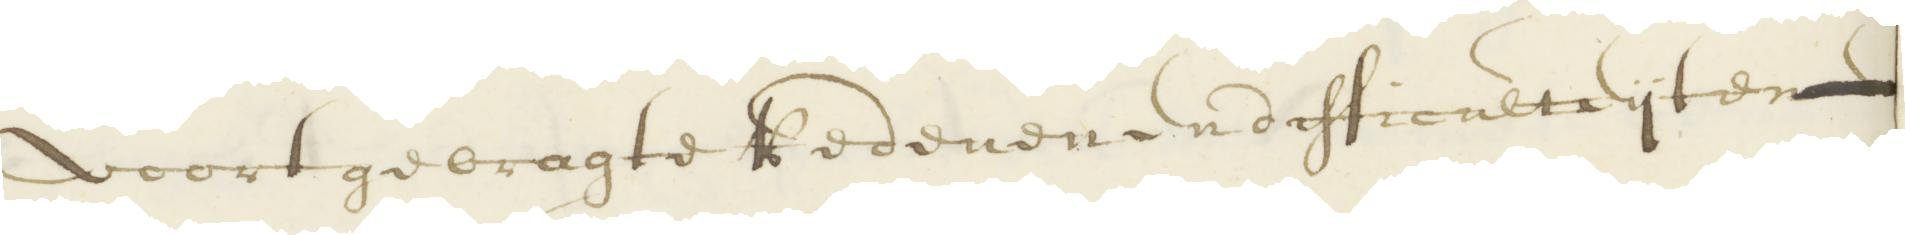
voort gebragte Redenen en difficulteijten
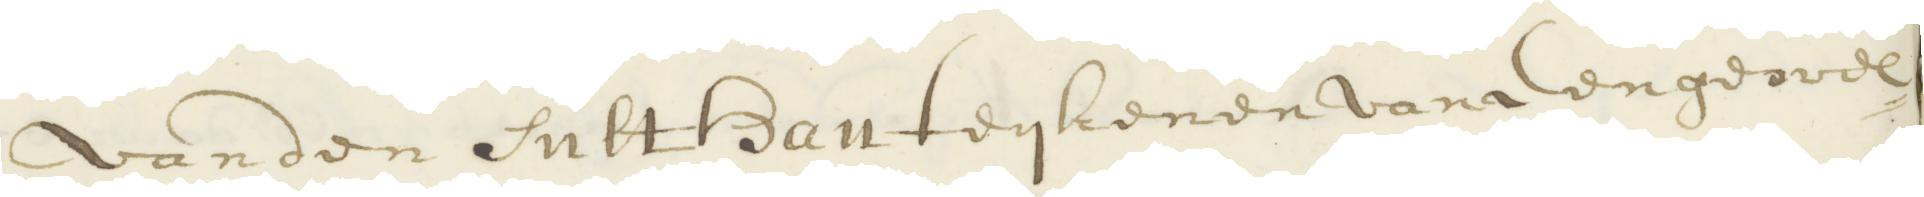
van den sulthan teykenen van Een gewel„
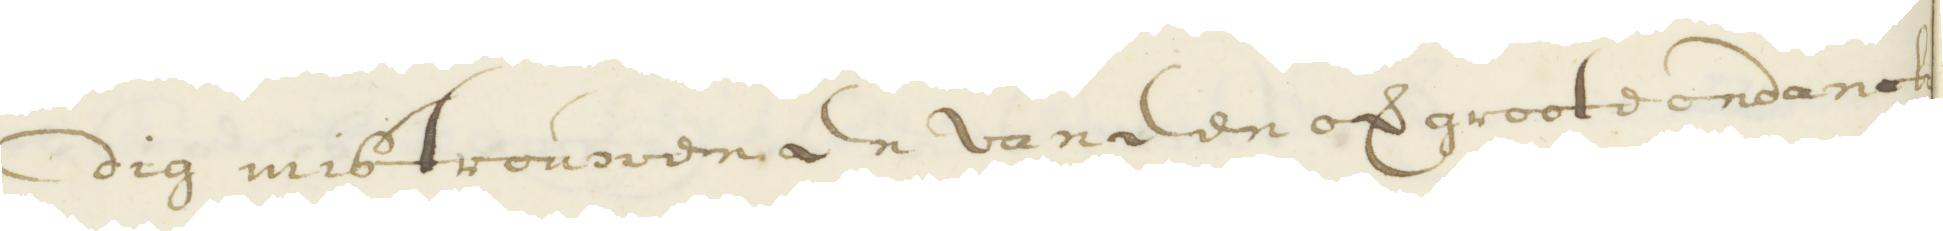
dig mistrouwen en van een overgroote ondanck
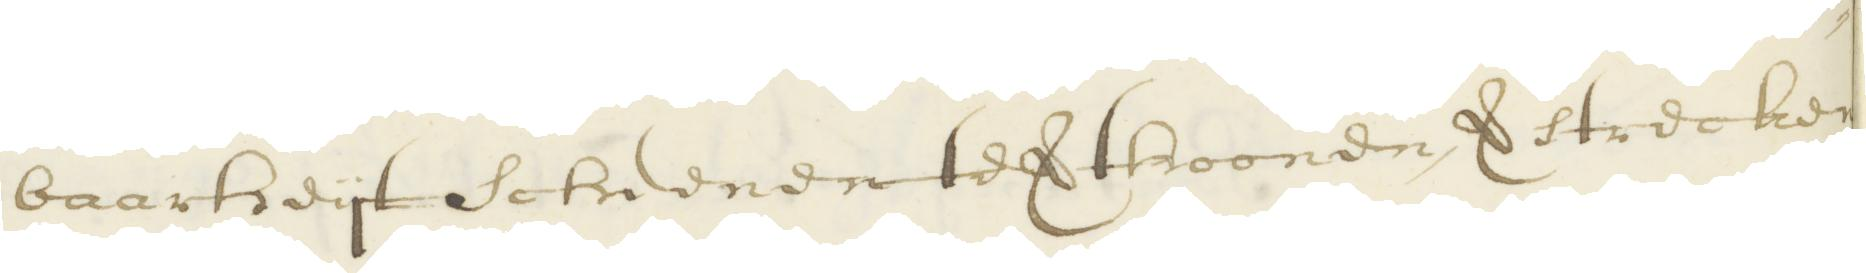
baarheijt scheenen te verthoonen, verstrecken
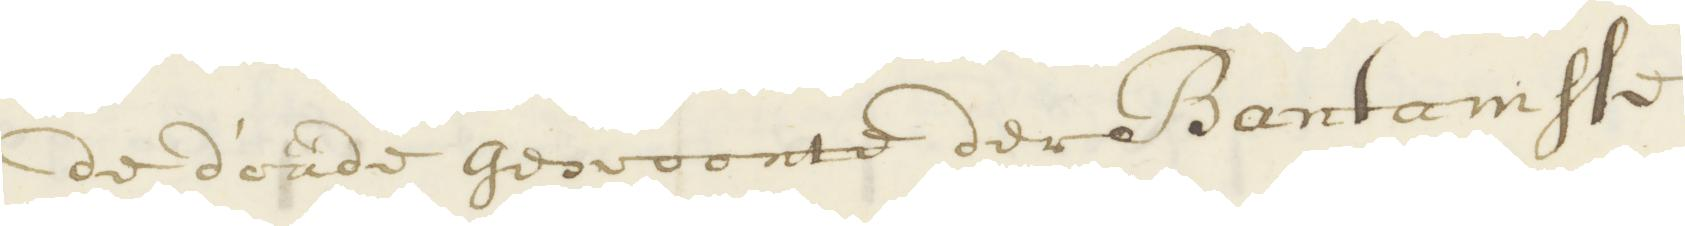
de d'oude gesvoorte der Bantamsse
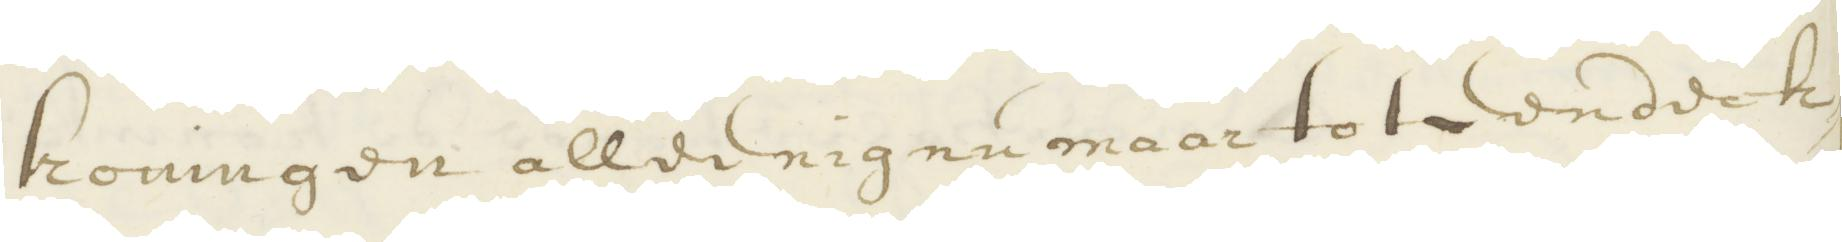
koningen alleenig nu maar tot een deck„
